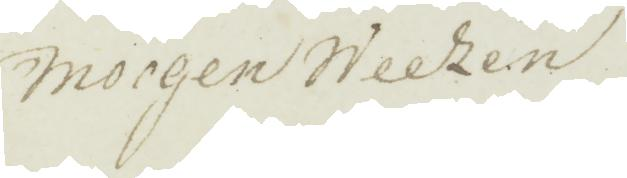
moogen weezen
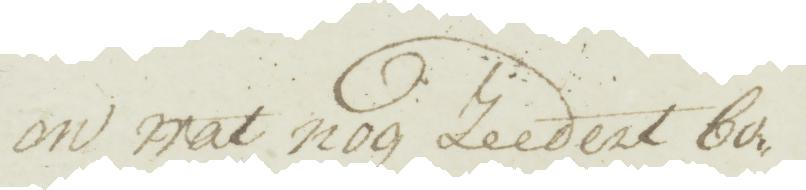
en wat nog zeedert bo„
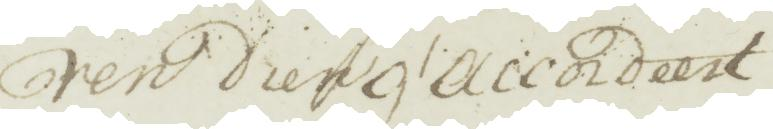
vendien g’accordeert
